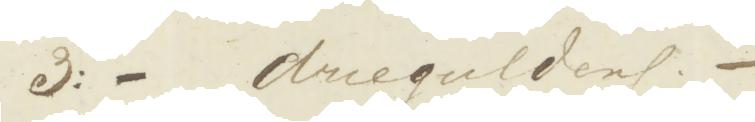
3: — drie guldens. -
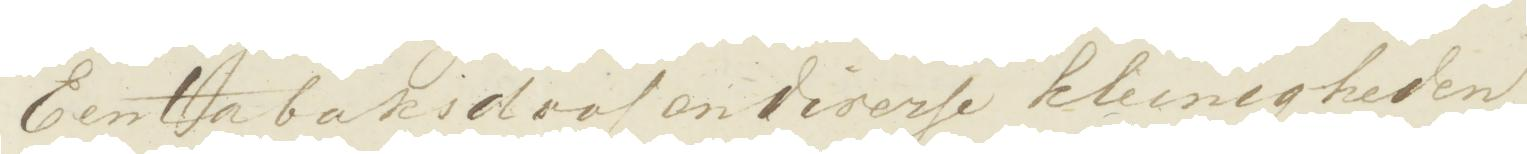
Een tabaksdoos en diverse kleinigheden
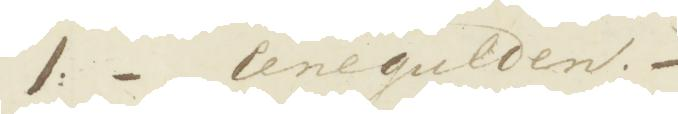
1: — Eene gulden.-
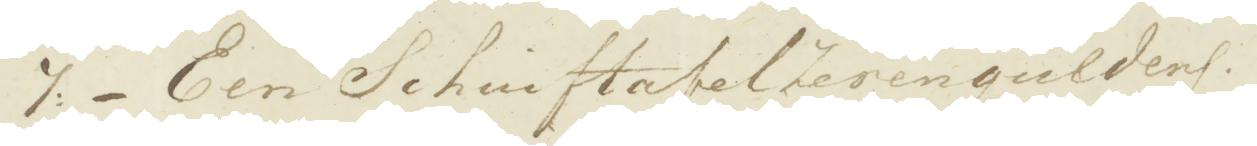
7: — Een Schuiftafel zeven guldens.
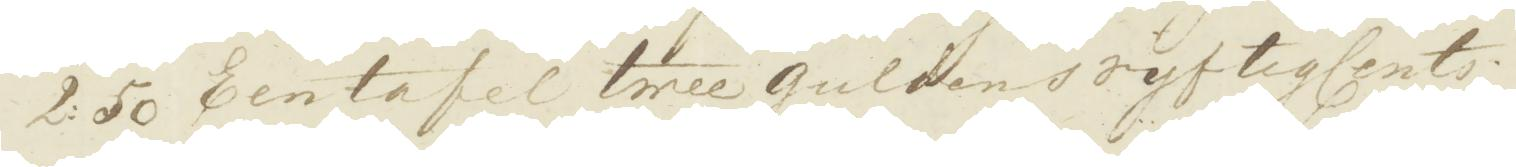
2:50 Een tafel twee guldens vyftig cents.
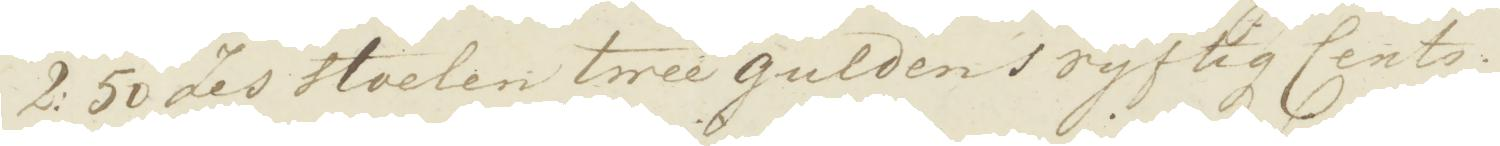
2: 50 zes stoelen twee guldens vijftig cents.
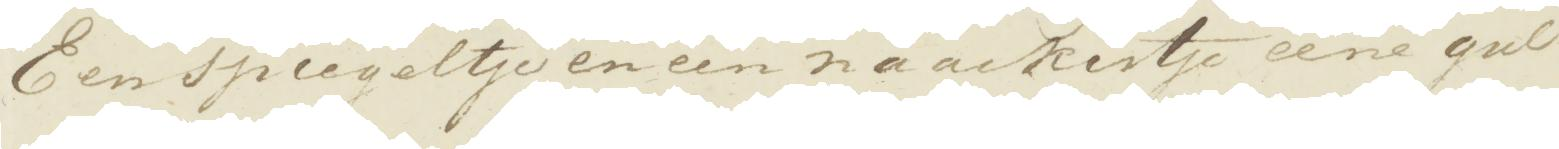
Een spiegeltje en een naaikistje eene gul
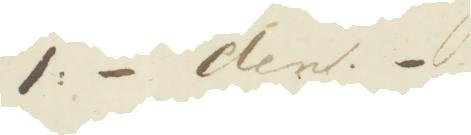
1: — den.—
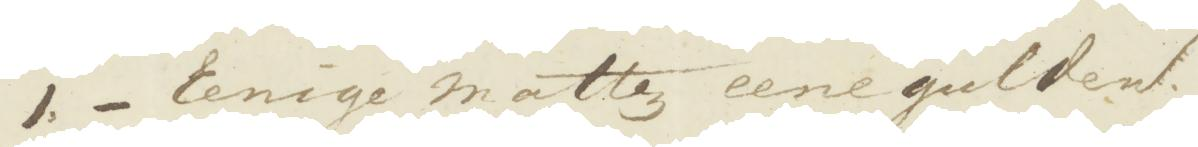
1: — Eenige matten eene gulden.
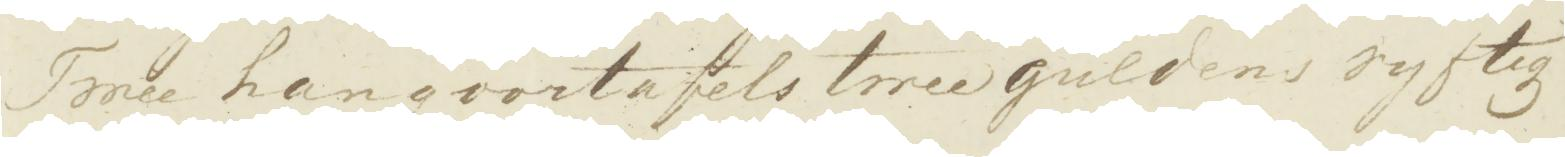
Twee hangoortafels twee guldens vyftig
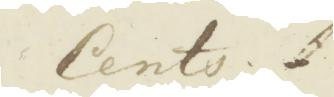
Cents. -
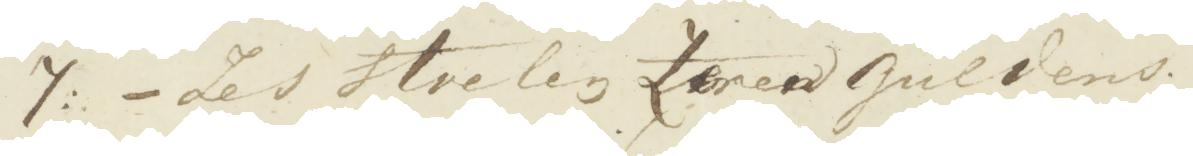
7: — Zes stoelen Zeven guldens.
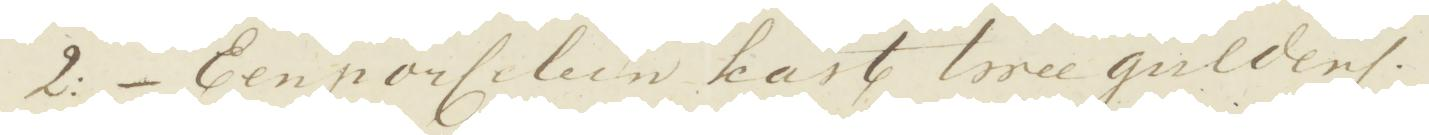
2: — Een porcelein kast twee guldens.
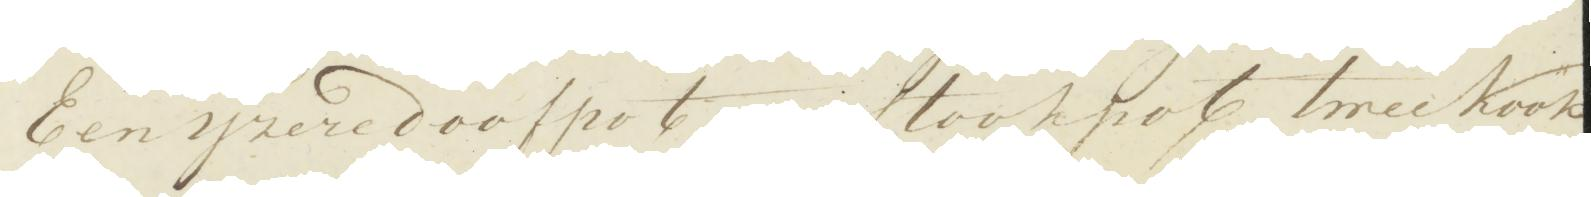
Een yzere doofpot een stookpot twee kook
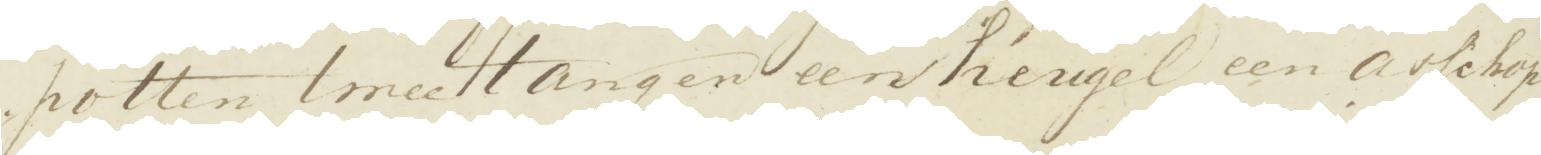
„potten twee tangen een hengel een asschop
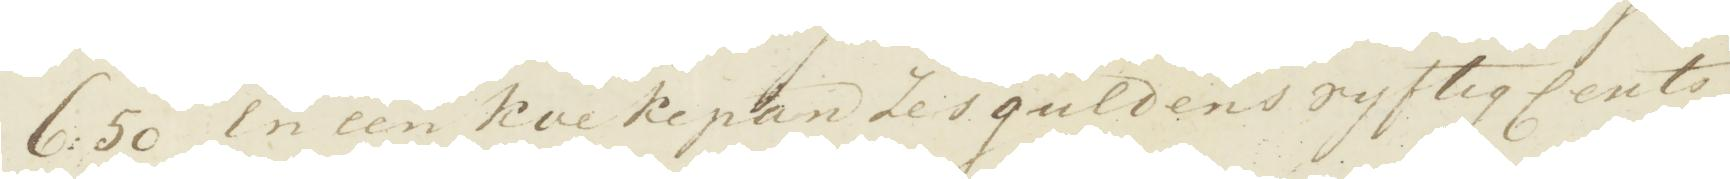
6:50 En een koekepan zes guldens vyftig cents
